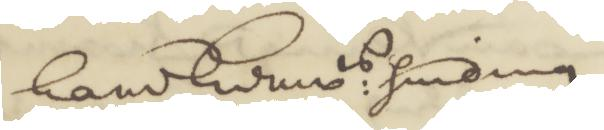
hare hern:s sending
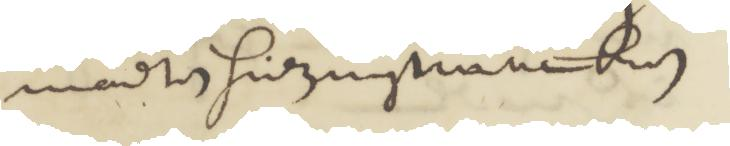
moeten sien gtnancken
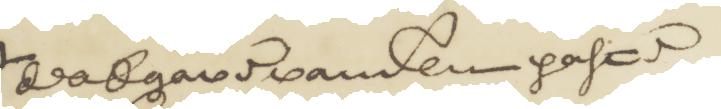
de afgave van Een pasce
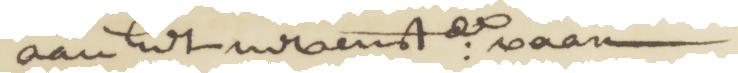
aan het nevenst:de vaar
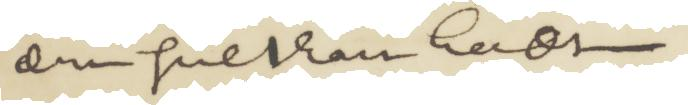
den sulthan heeft
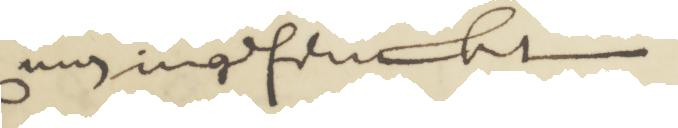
men ingeschickt
